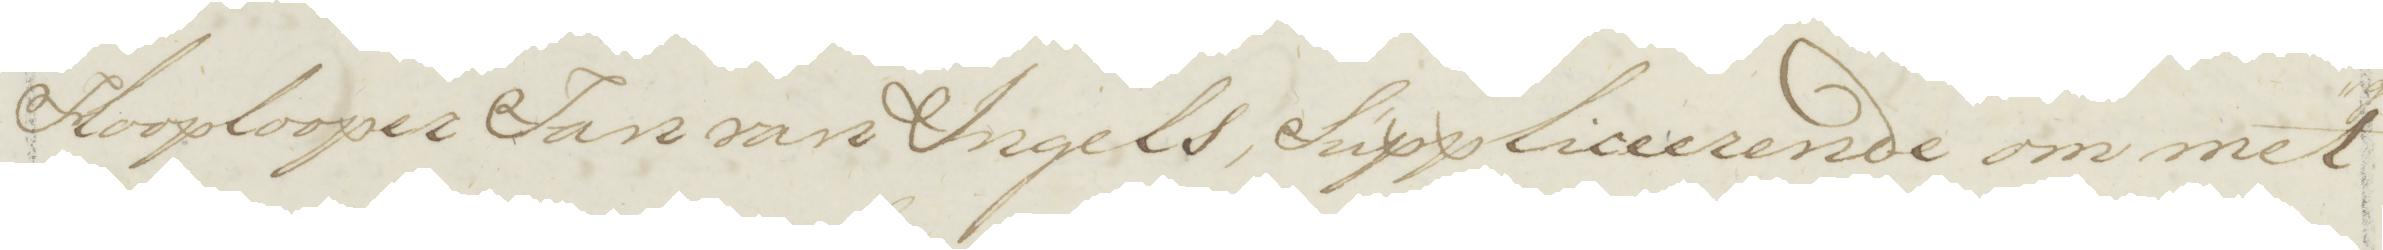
Hooplooper Jan van Ingels, suppliceerende om met
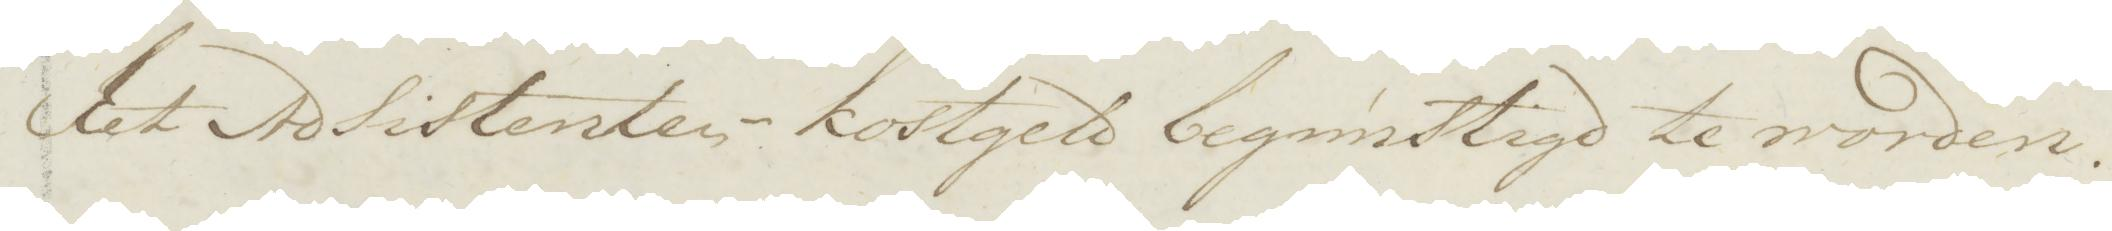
het Adsistenten-kostgeld begunstigd te worden.
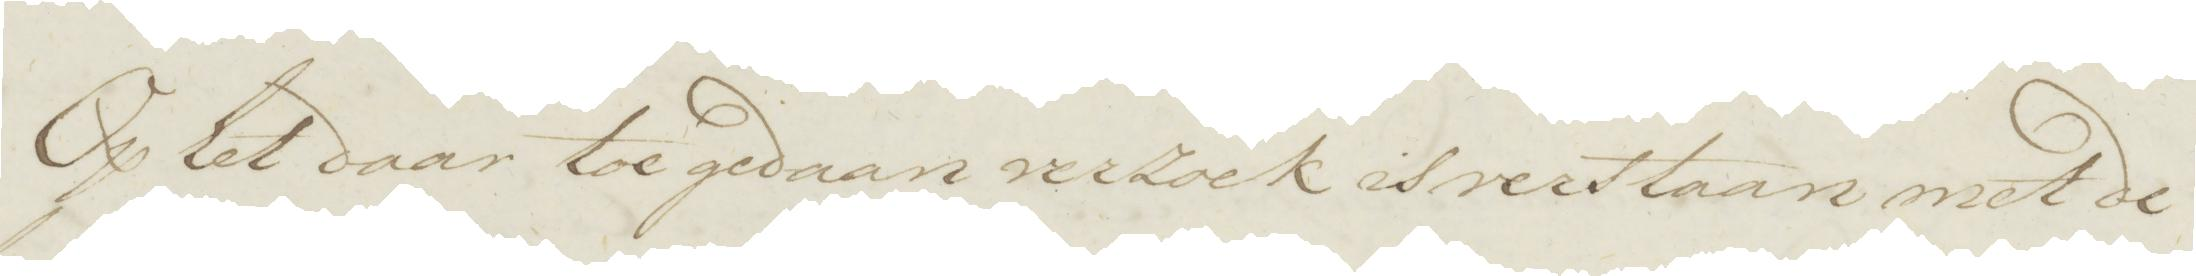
Op het daar toe gedaan verzoek is verstaan met de
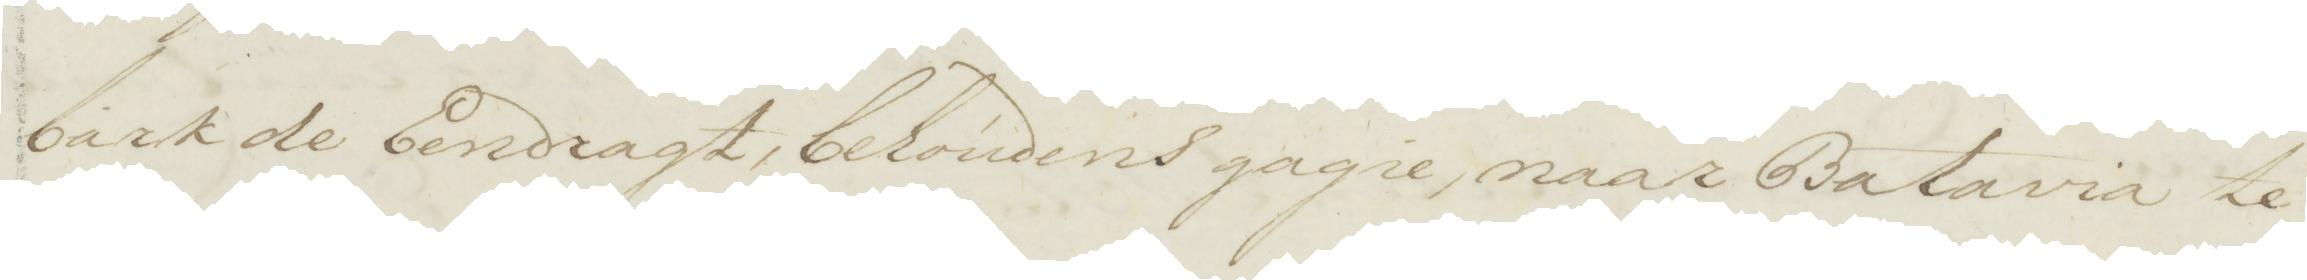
bark de Eendragt, behoudens gagie, naar Batavia te
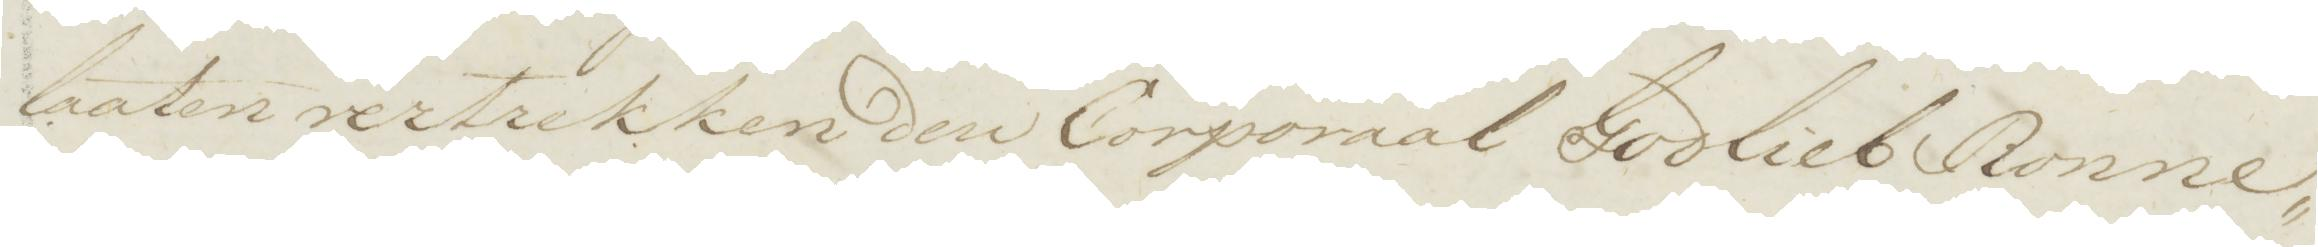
laaten vertrekken den Corporaal Godlieb Ronne„
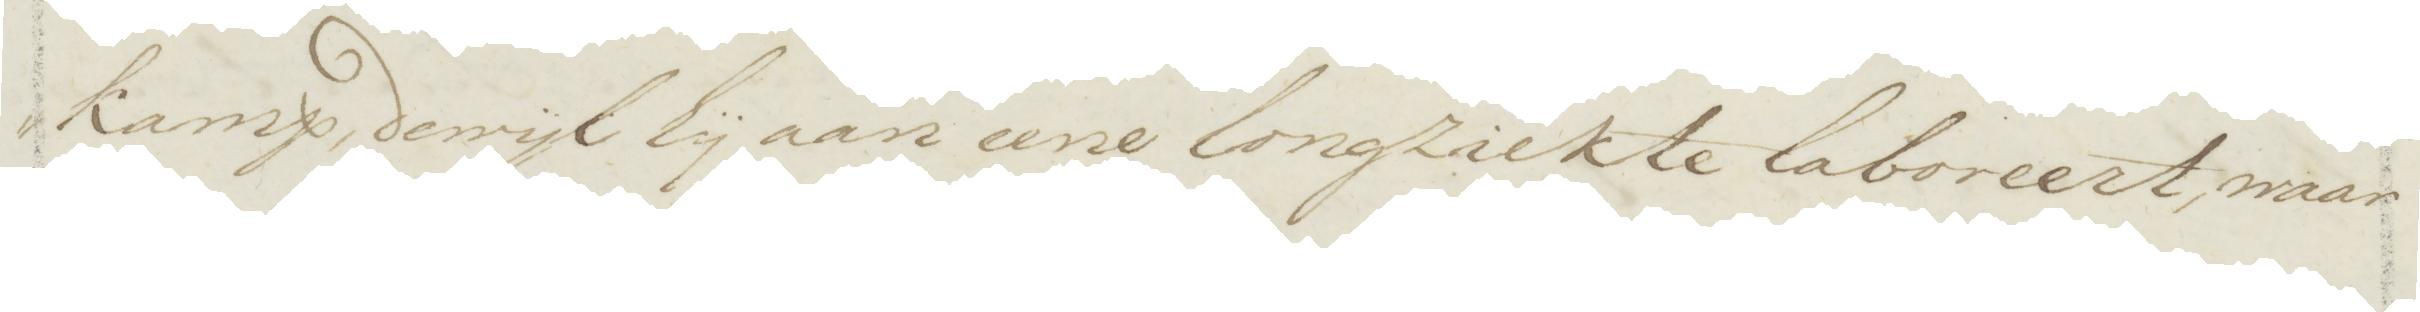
„kamp, dewijl hij aan eene longziekte laboreert, waar
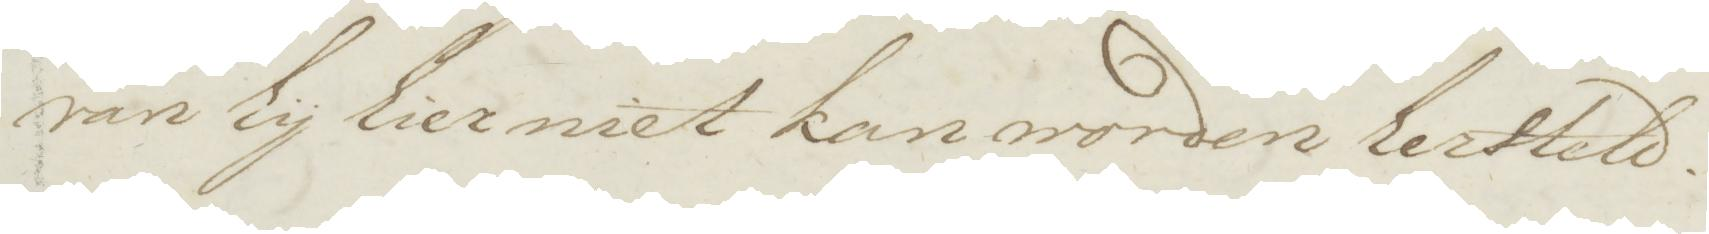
van hij hier niet kan worden hersteld.
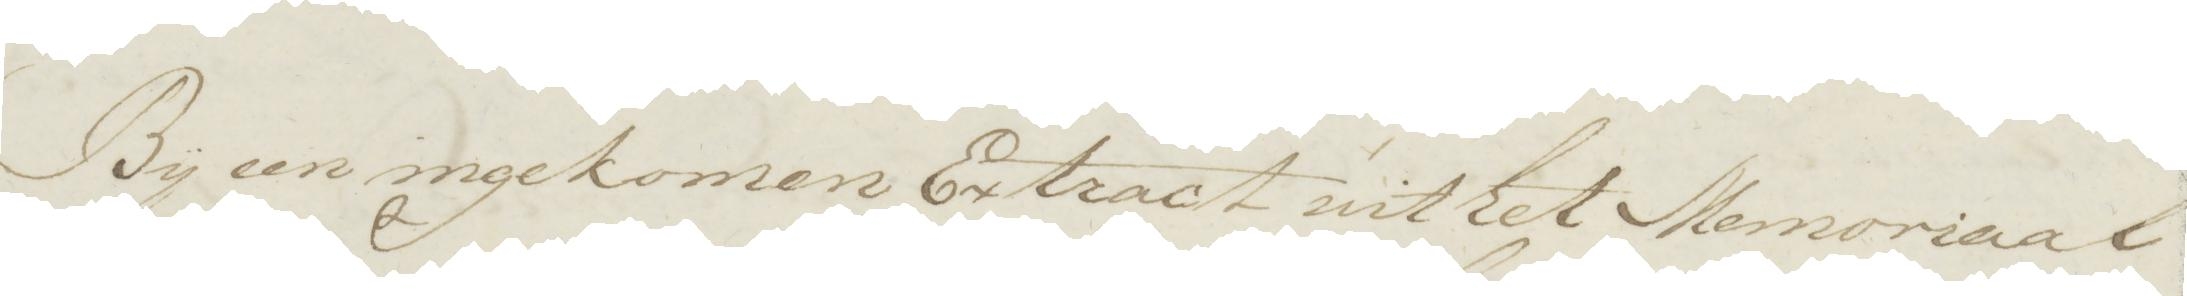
Bij een ingekomen Extract uit het Memoriaal
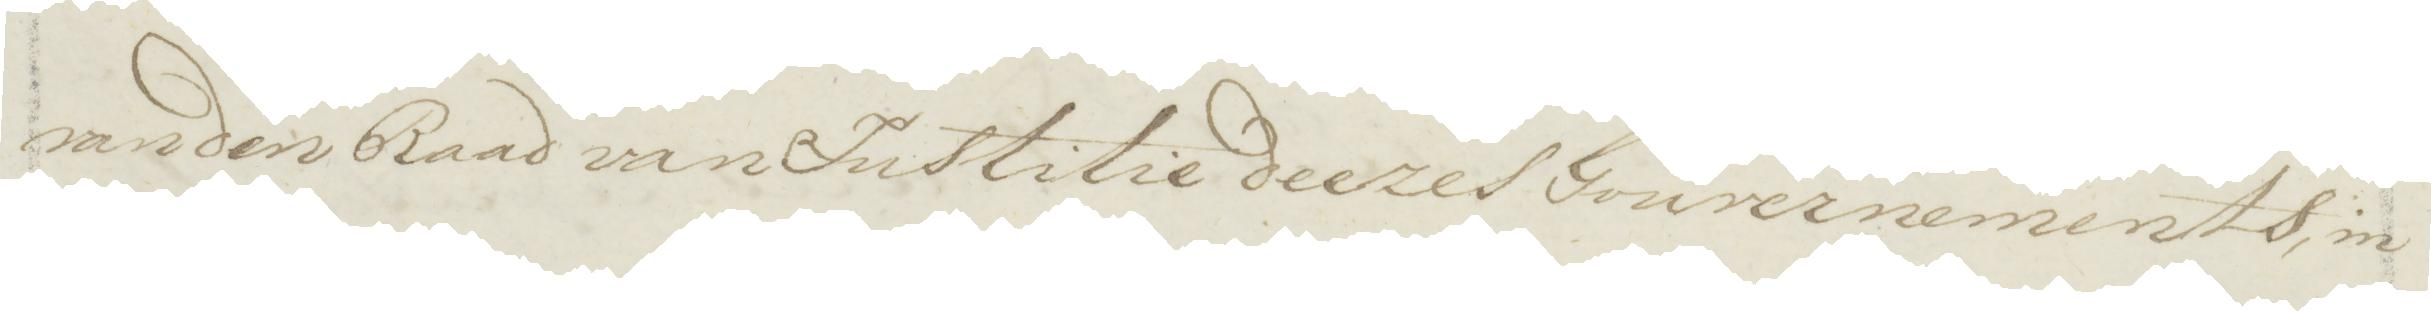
van den Raad van Justitie deezes Gouvernements, in
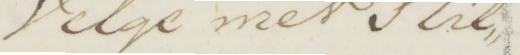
Velge met stil„
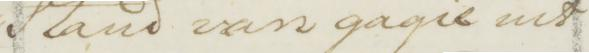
stand van gagie uit
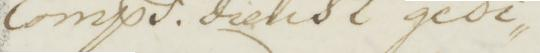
Comps. dienst gedi„
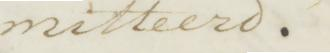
mitteerd.
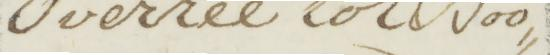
Overree tot Boo„
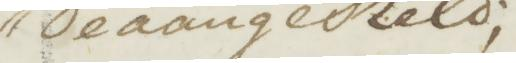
„de aangesteld;
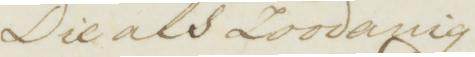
Die als zoodanig
